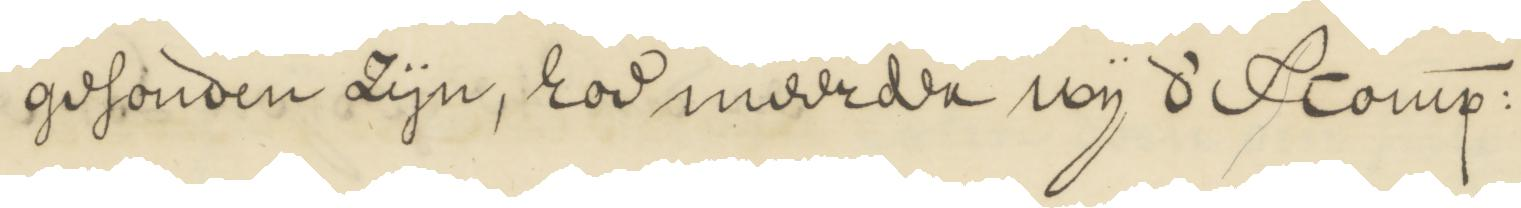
gesonden zijn, hoe meerder wij d’ Ecomp:
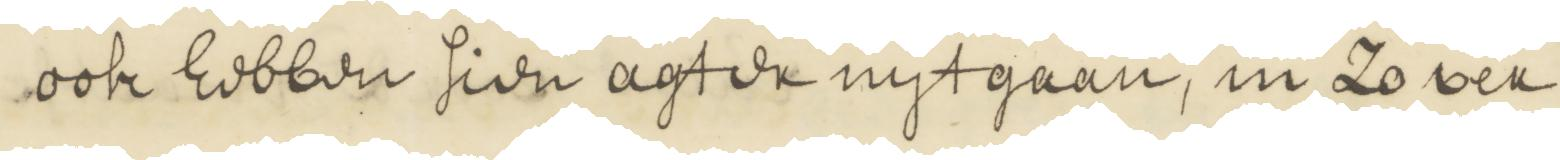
ook hebben sien agter uijtgaan, in zo ver
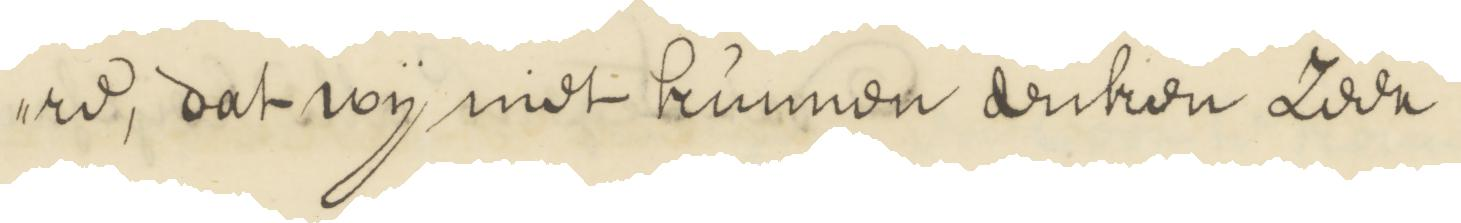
„re, dat wij niet kunnen denken zeer
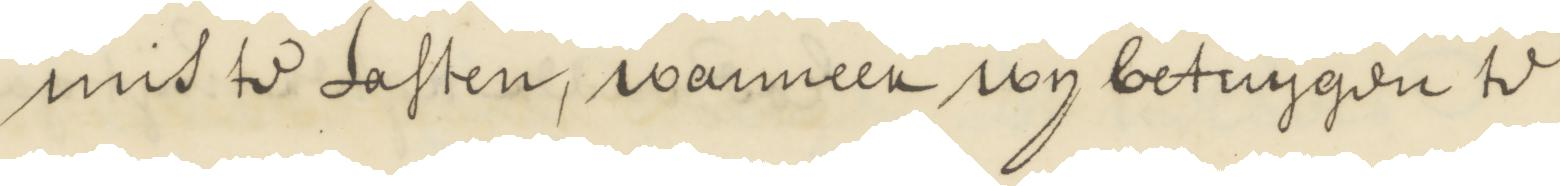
mis te tasten, wanneer wij betuijgen te
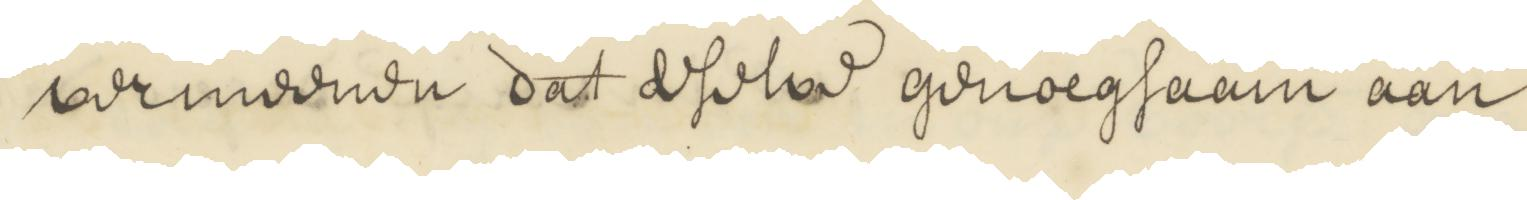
vermeenen dat deselve genoegsaam aan
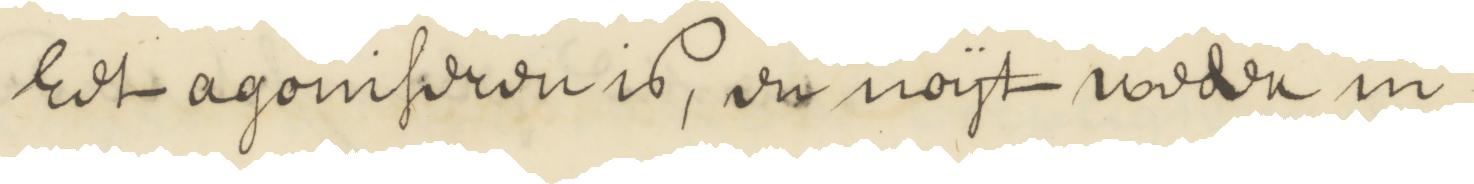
het agoniseren is, en noijt weder in
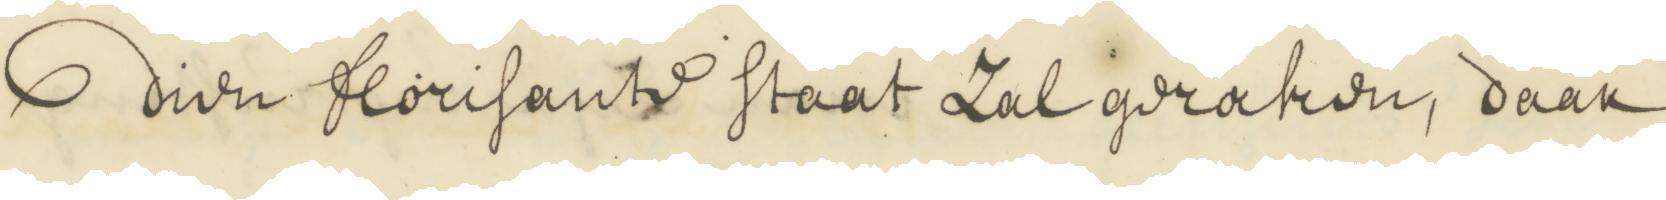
dien florisante staat zal geraken, daar
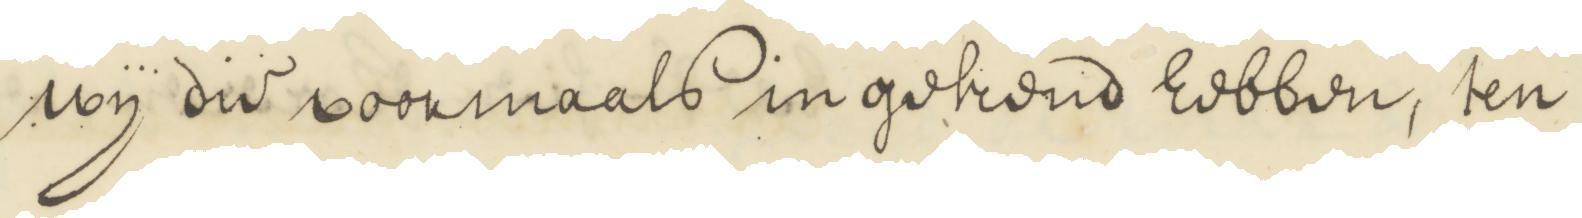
wij die voormaals in gekend hebben, ten
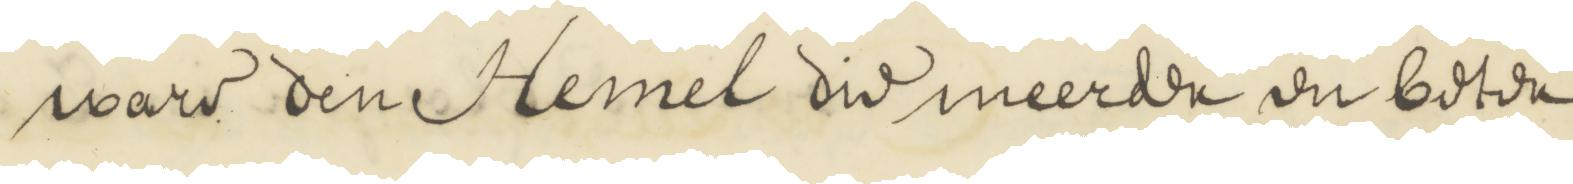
ware den Hemel die meerder en beter
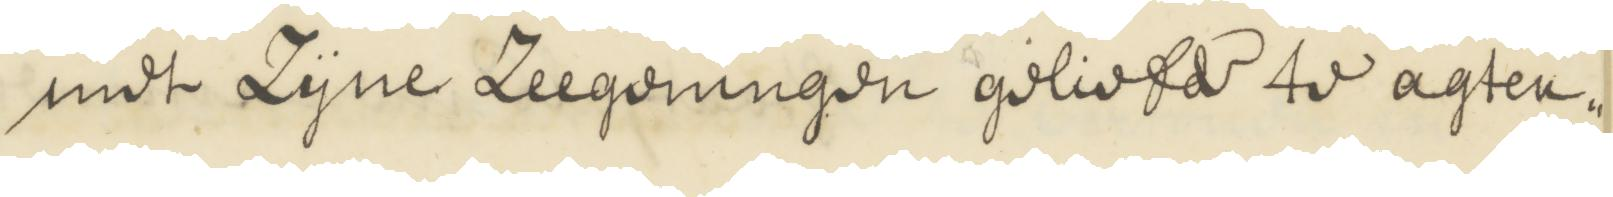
met zijne zeegeningen geliefde te agter„
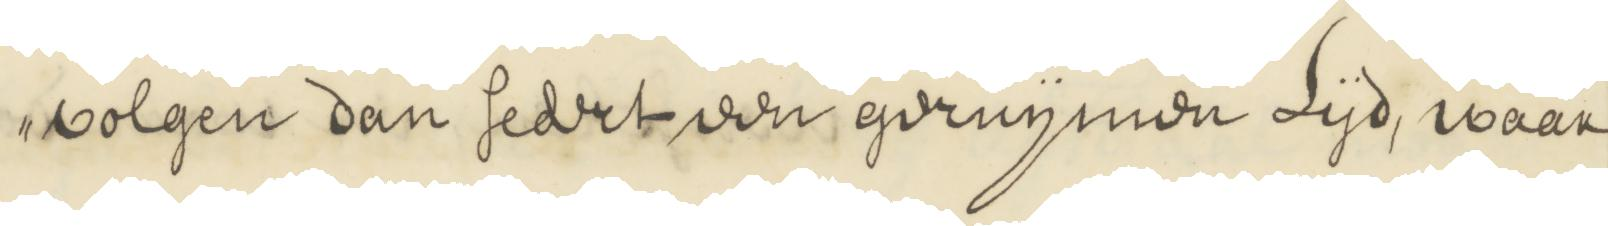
„volgen dan sedert een geruijmen tijd, waar
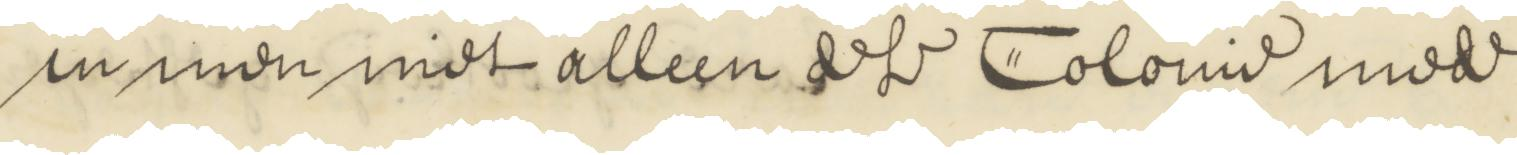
in men niet alleen dese Colonie mede
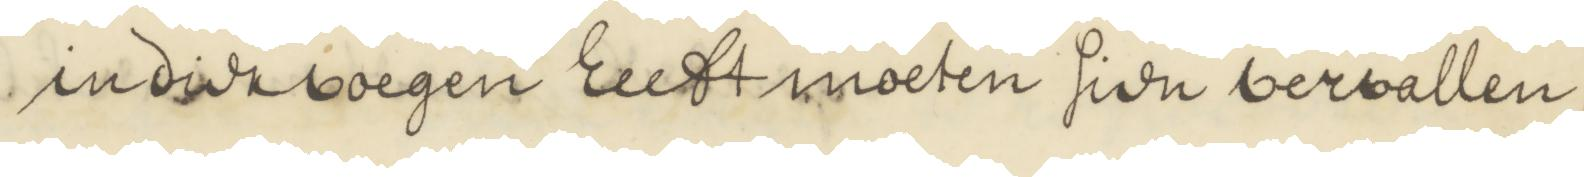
indiervoegen heeft moeten sien vervallen,
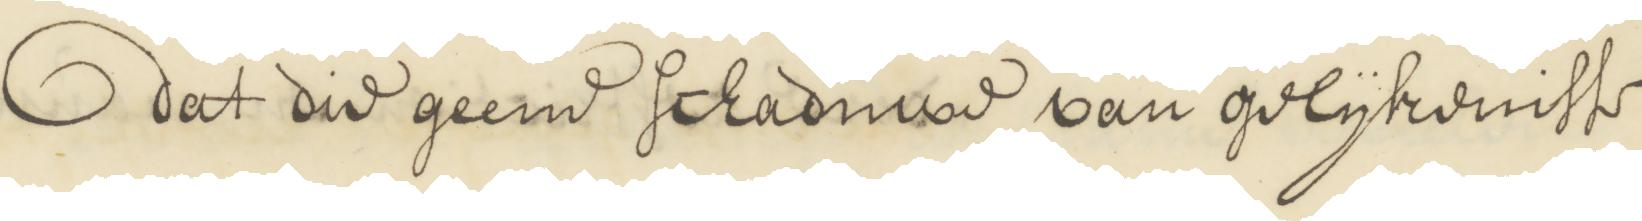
dat die geene schaduwe van gelijkenisse
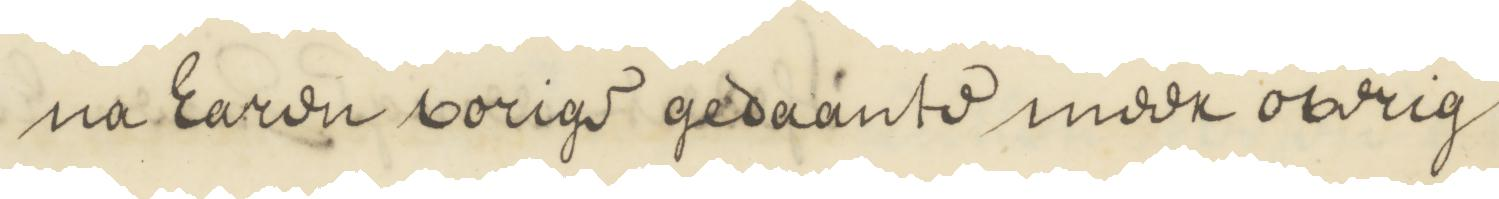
na haren vorige gedaante meer overig
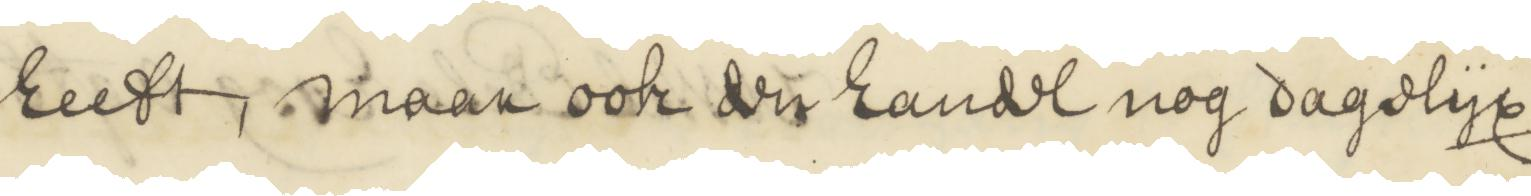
heeft, maar ook den handel nog dagelijx
